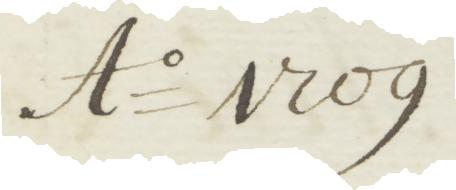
A=o 1709
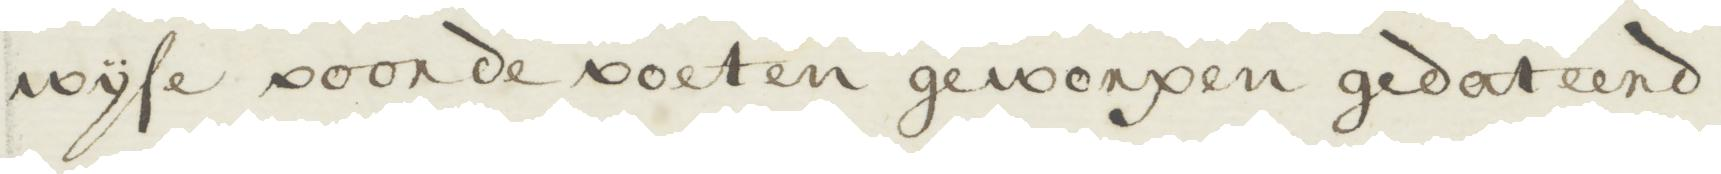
wijse voor de voeten geworpen gedateerd
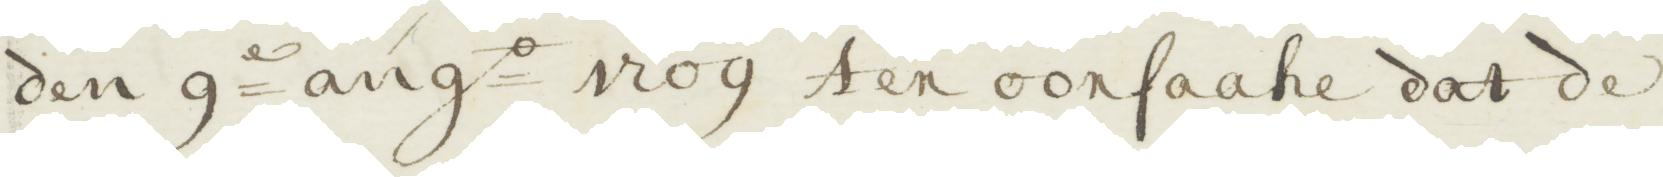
den 9=e aug=o 1709 ter oorsaake dat de
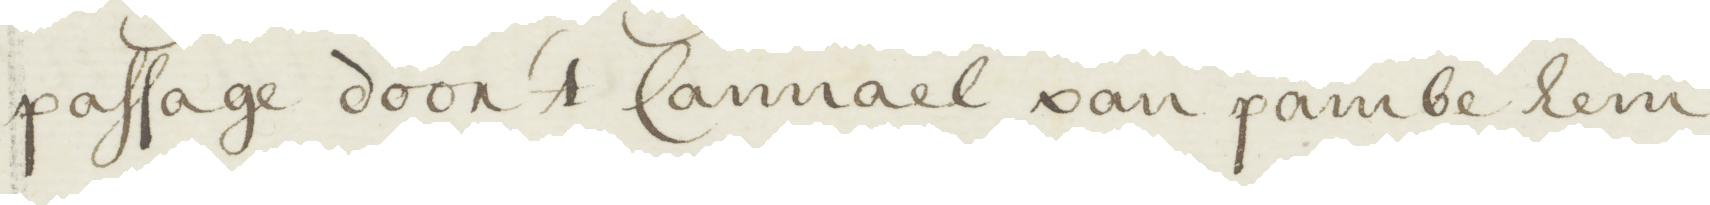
passage door ’t Cannael van pambe hem
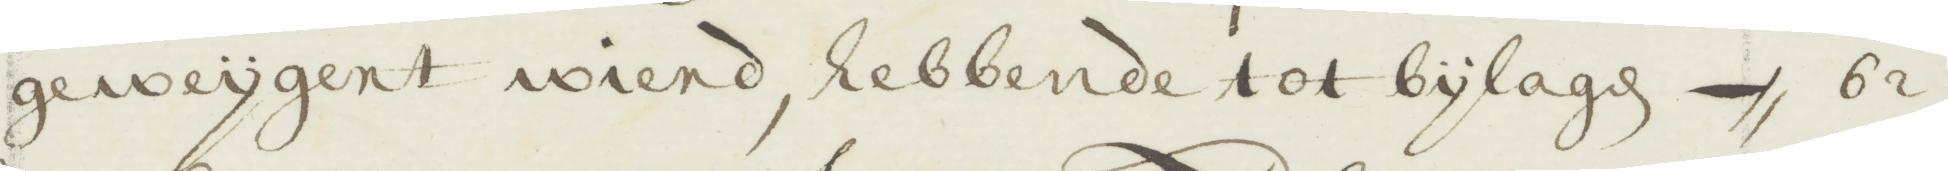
geweijgert wierd, hebbende tot bijlagen —„ 62
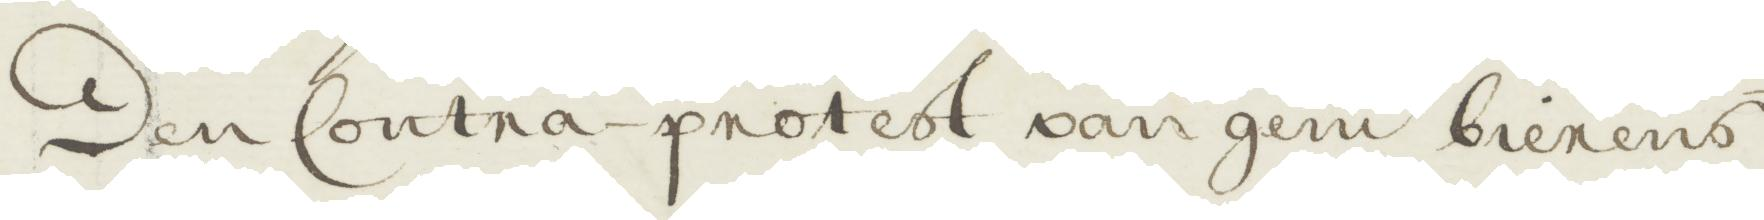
Den Contra-protest van gem bierens
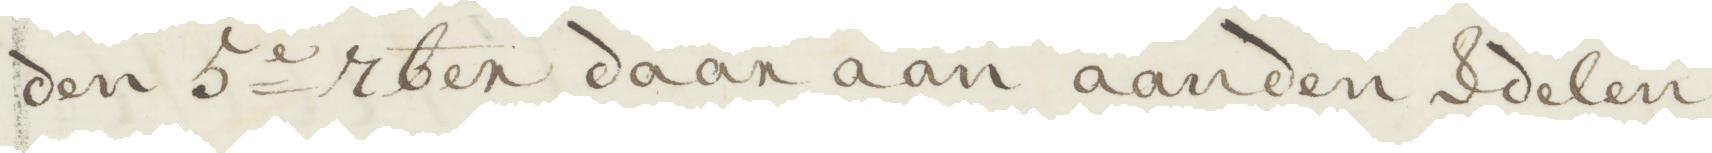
den 5=e 7ber daar aan aanden Edelen
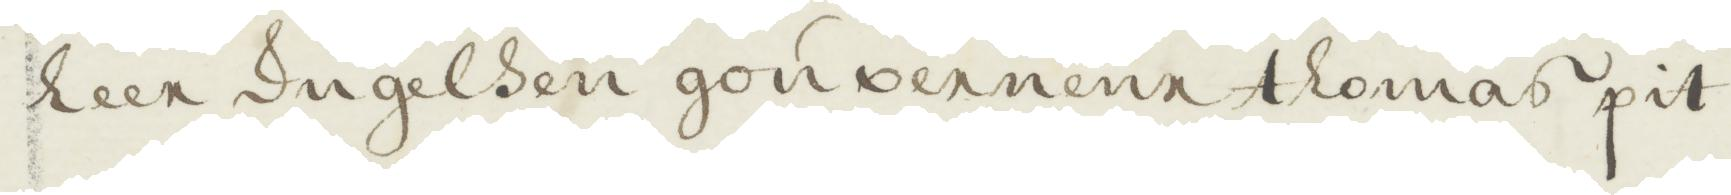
heer Engelsen gouverneur thomas pit
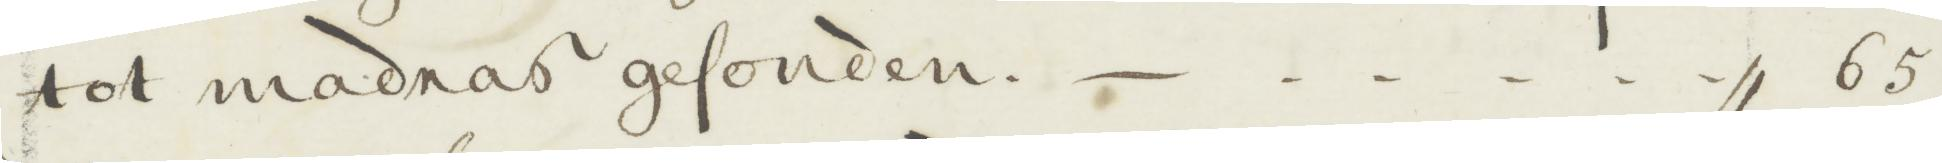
tot madras gesonden. — - - - - - „ 65
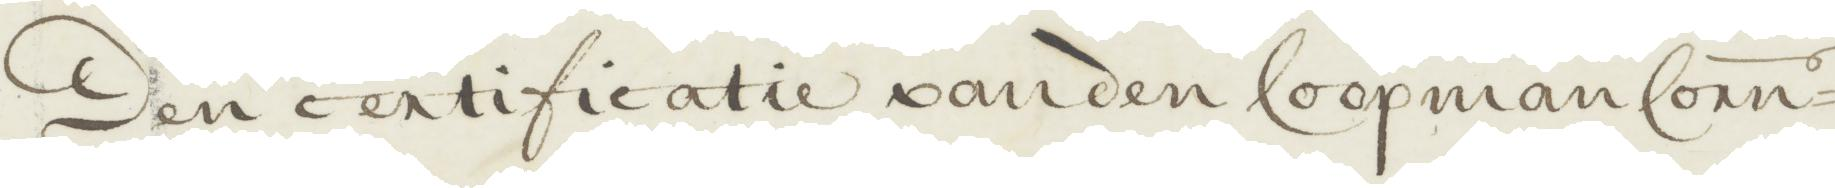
Den certificatie vanden Coopman Corn=s
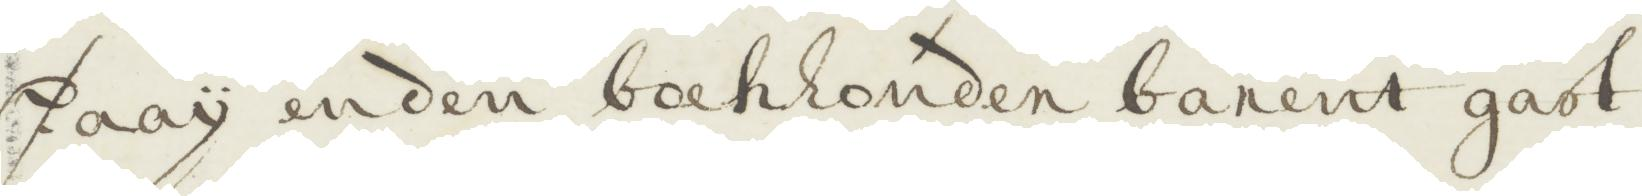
Taaij en den boekhouder barent gast
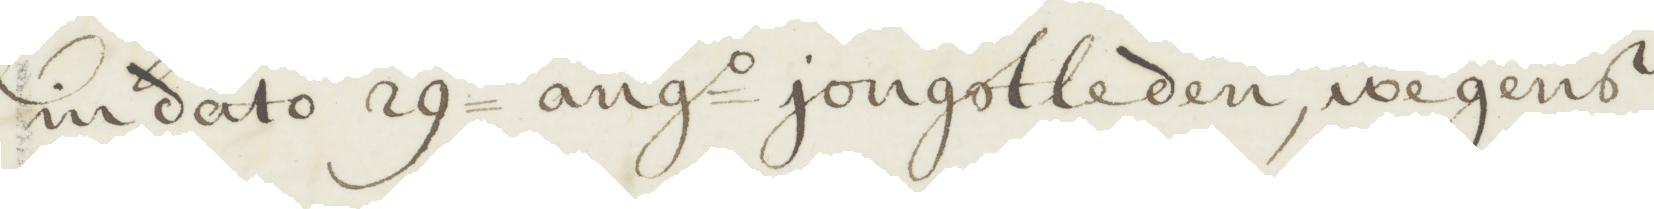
in dato 29=e aug=o jongstleden, wegens
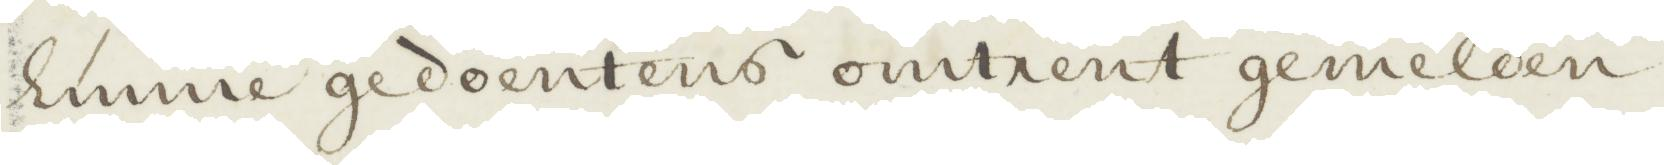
hunne gedoentens omtrent gemelden
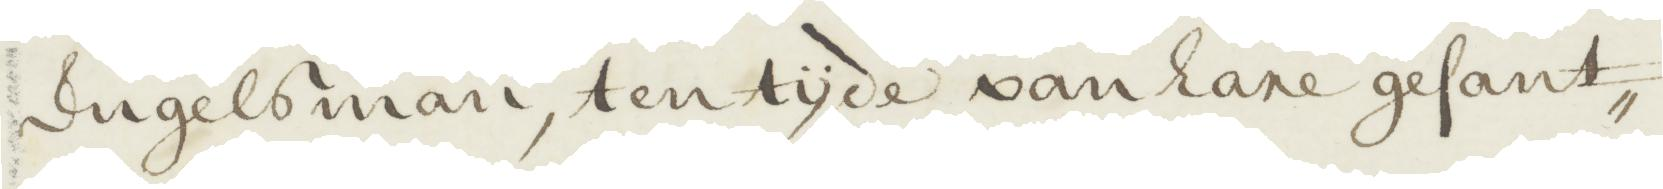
Engelsman, ten tijde van hare gesant„
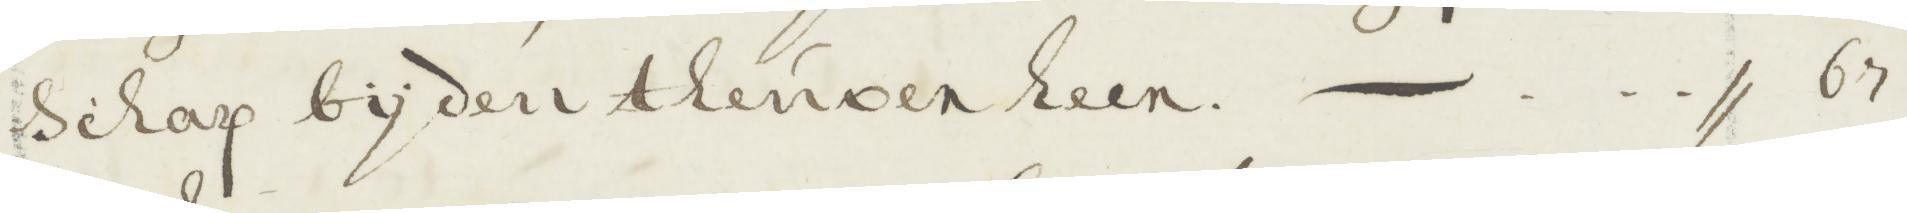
schap bijden theuver heer. — - - - „ 67
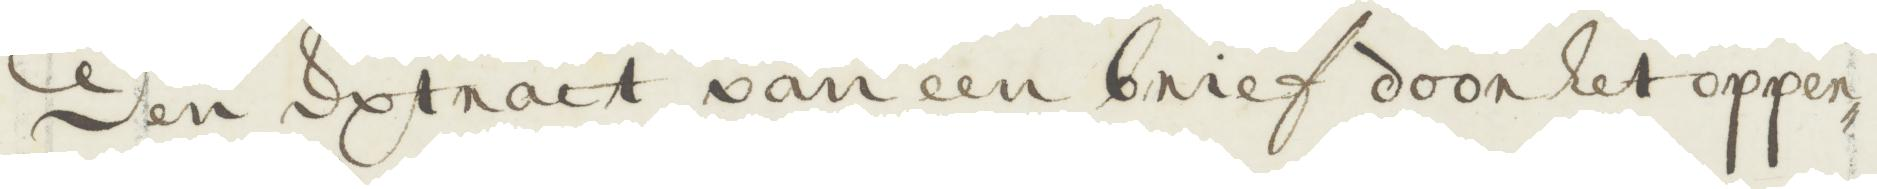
Den Extract van een brief door het opper„
